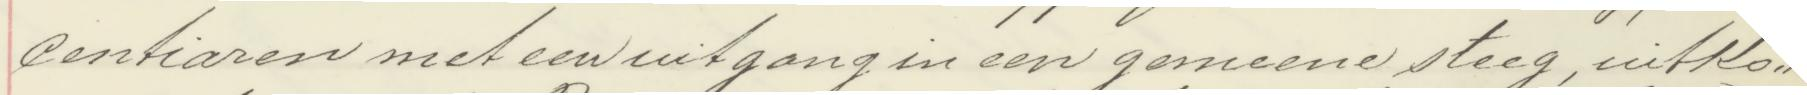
centiaren met een uitgang in een gemeene steeg, uitko„
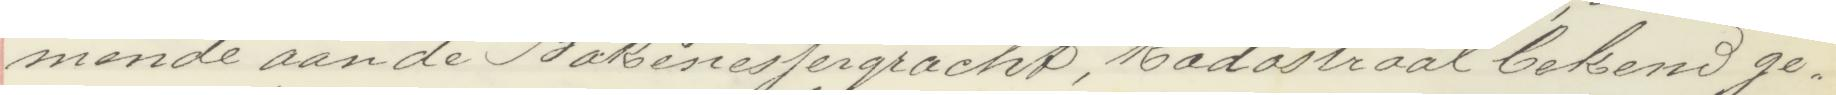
mende aan de Bakenessergracht, Kadastraal bekend ge„
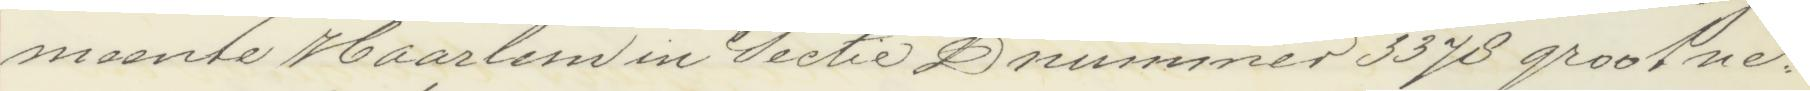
meente Haarlem in sectie D nummer 3378 groot ne„
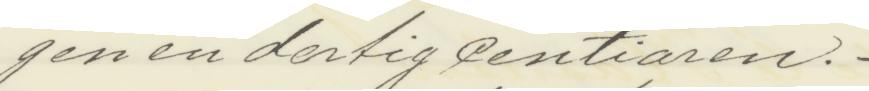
gen en dertig centiaren.
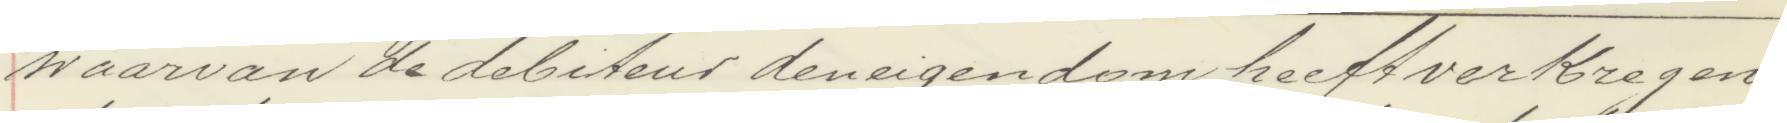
waarvan de debiteur den eigendom heeft verkregen
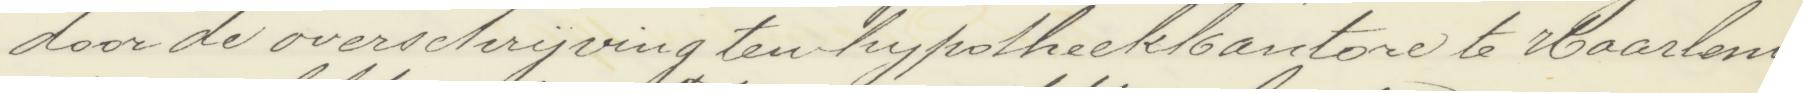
door de overschrijving ten hypotheekkantore te Haarlem
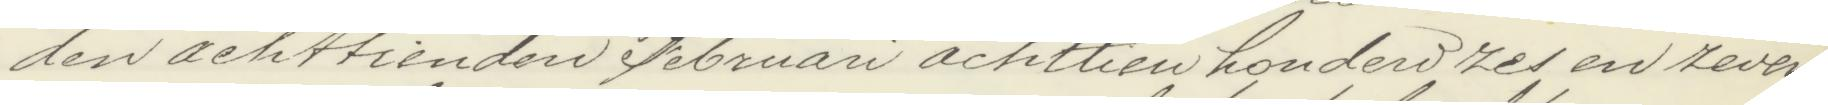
den achttienden Februari achttien honderd zes en zeven
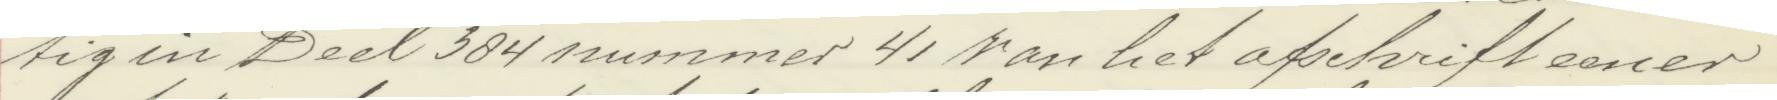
tig in Deel 387 nummer 71 van het afschrift eener
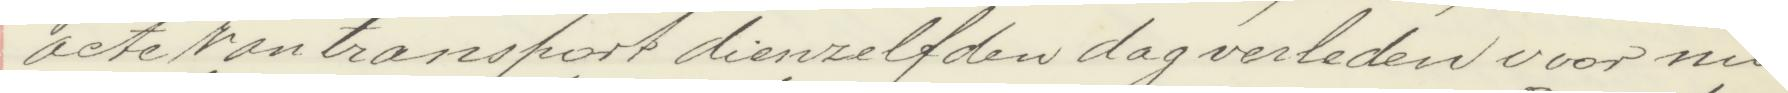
acte van transport dienzelfden dag verleden voor nu
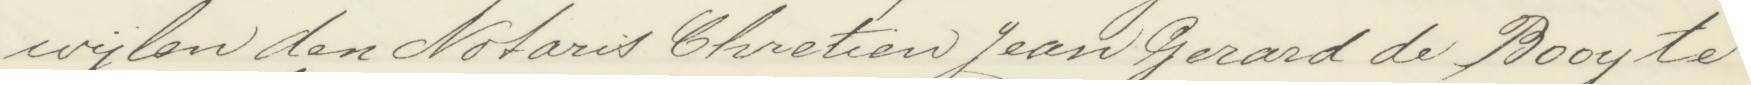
wijlen den Notaris Chretien Jean Gerard de Booy te
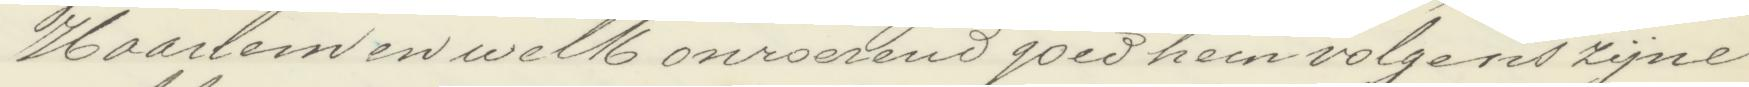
Haarlem en welk onroerend goed hem volgens zijne
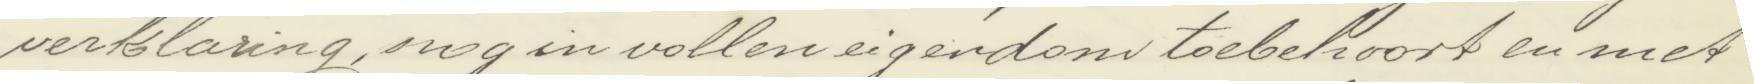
verklaring, nog in vollen eigendem toebehoort en met
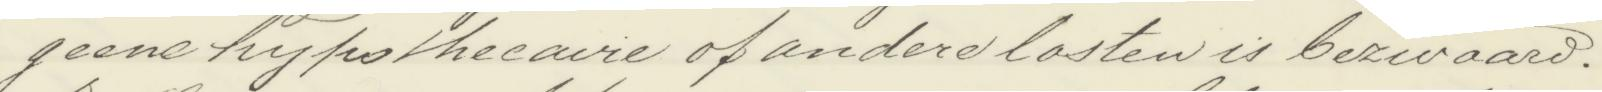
geene hypothecaire of andere lasten is bezwaard.
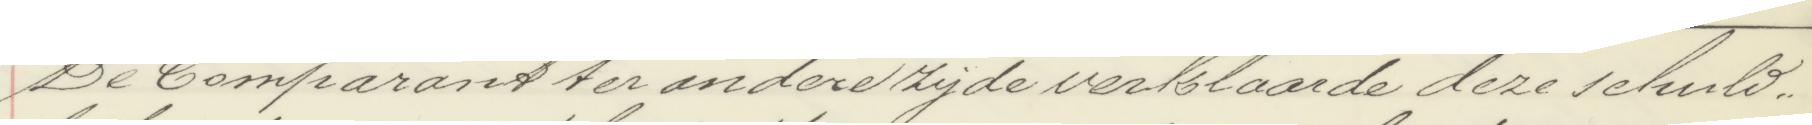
De Comparant ter andere zijde verklaarde deze schuld„
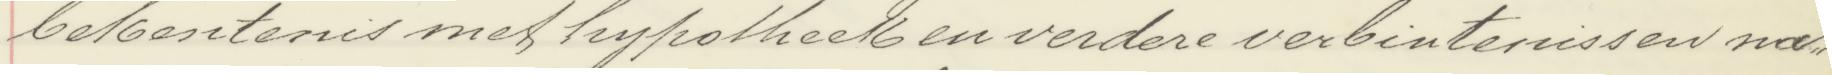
bekentenis met hypotheek en verdere verbintenissen na„
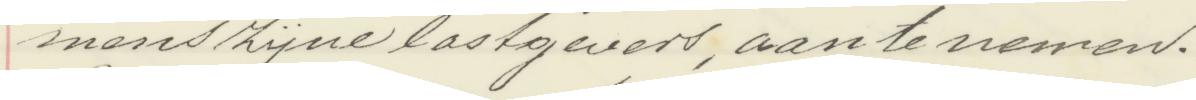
mens zijne lastgevers, aan te nemen.
